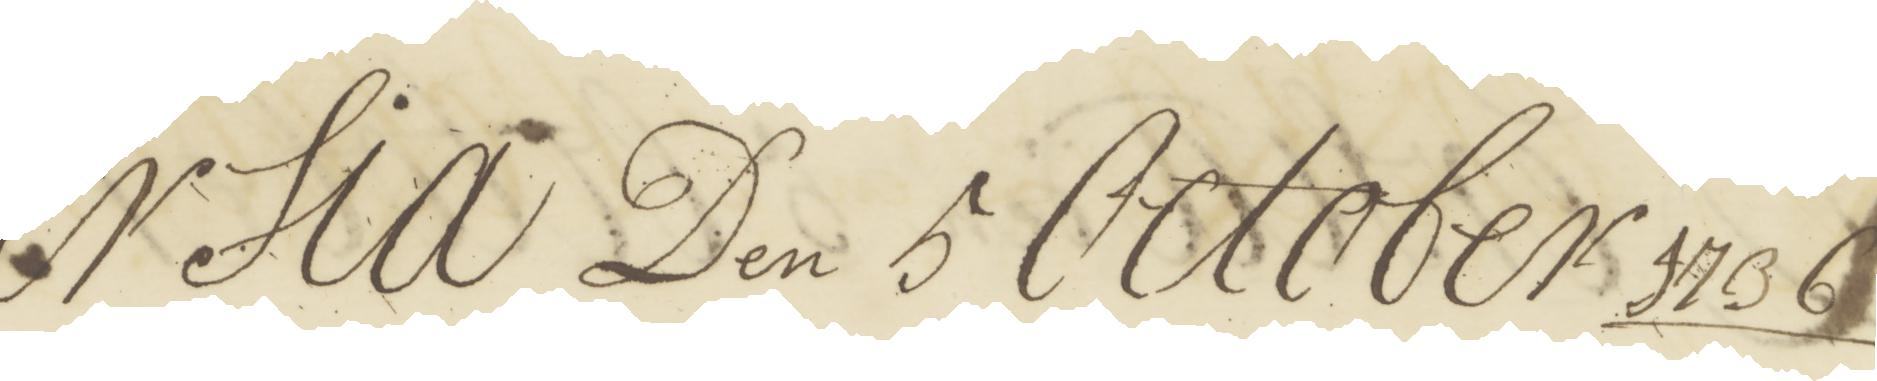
Persia Den 5 October 1736
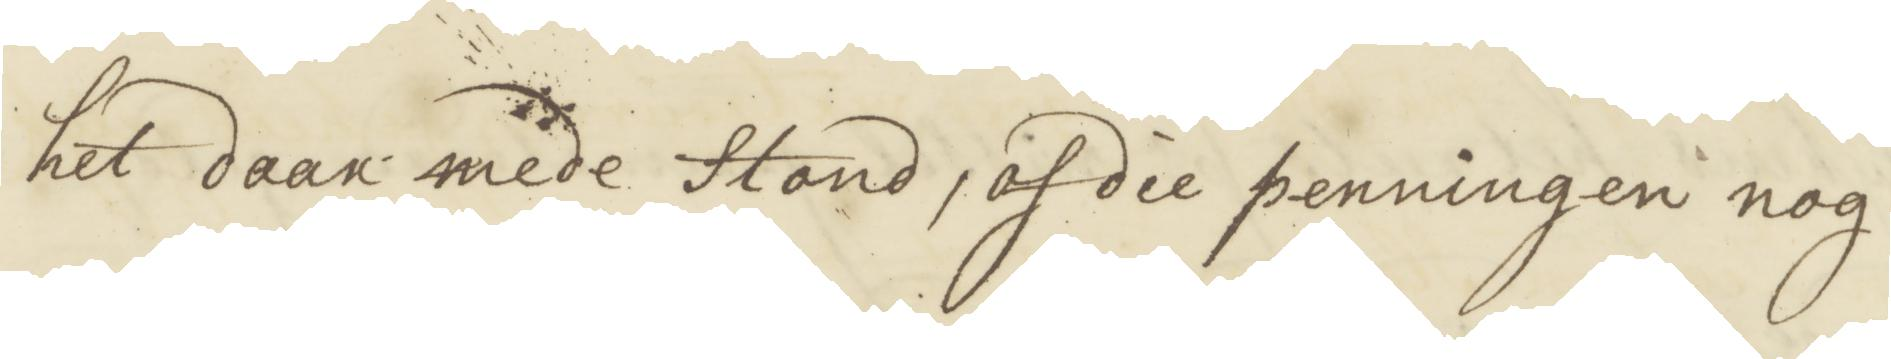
het daar mede stond, of die penningen nog
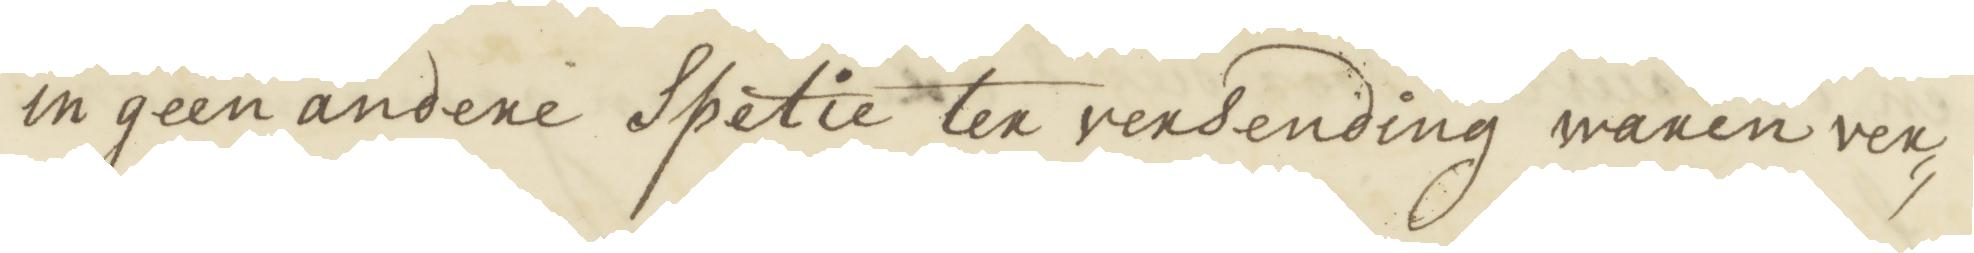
in geen andere spetie ter versending waren ver„
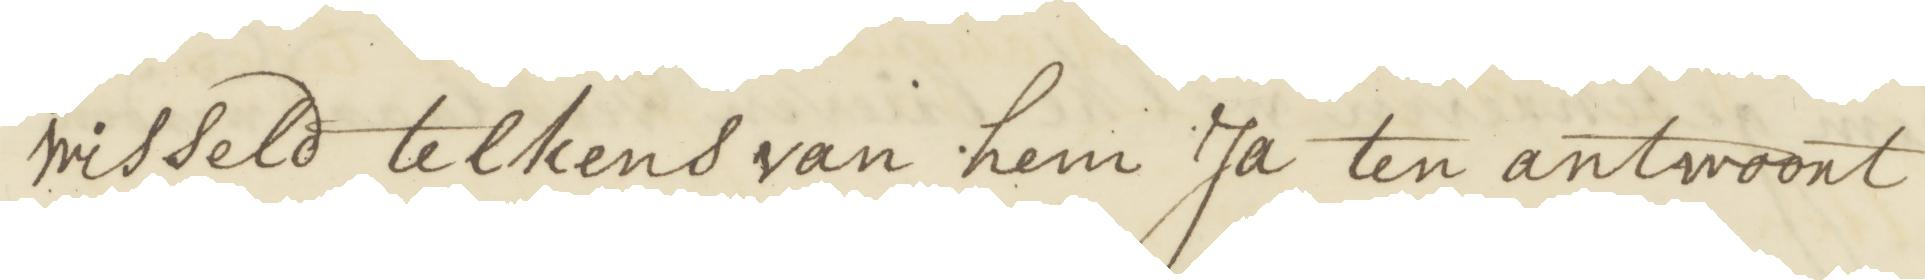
wisseld telkens van hem Ja ten antwoort
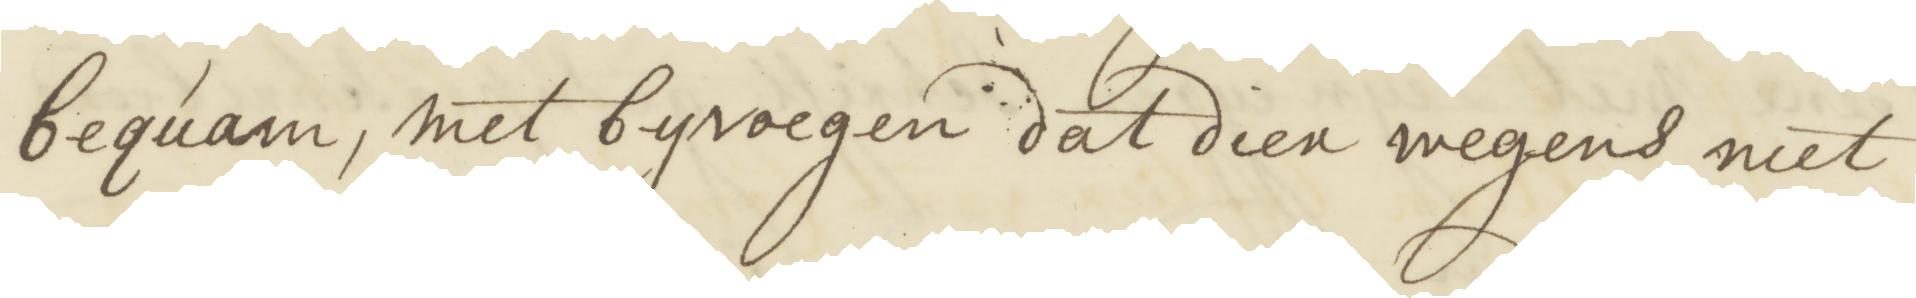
bequam, met byvoegen dat dier wegens niet
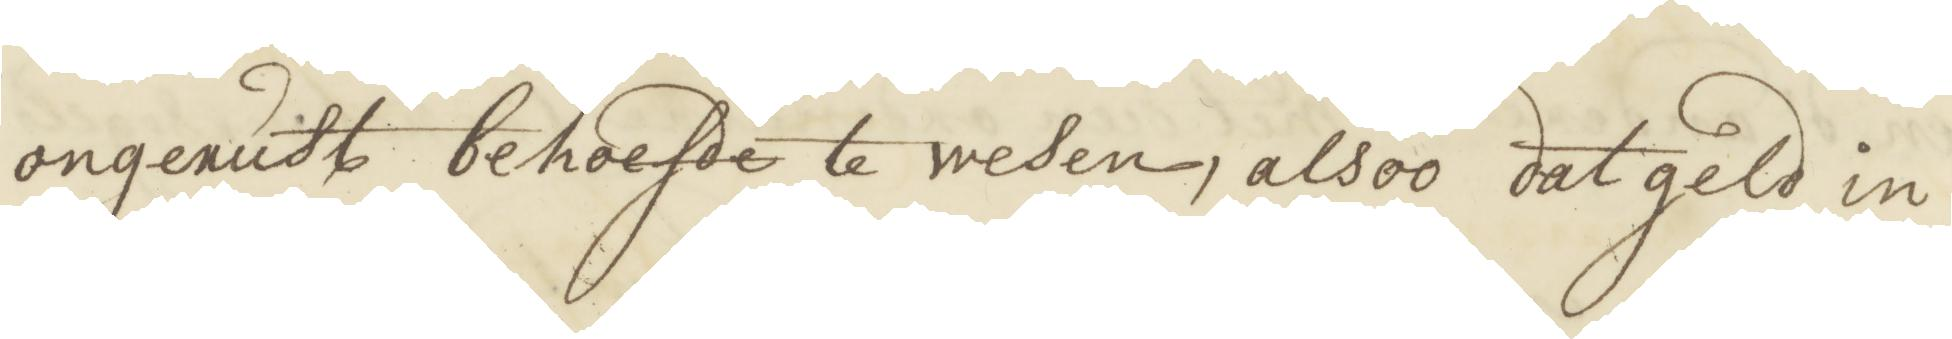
ongerust behoefde te wesen, alsoo dat geld in
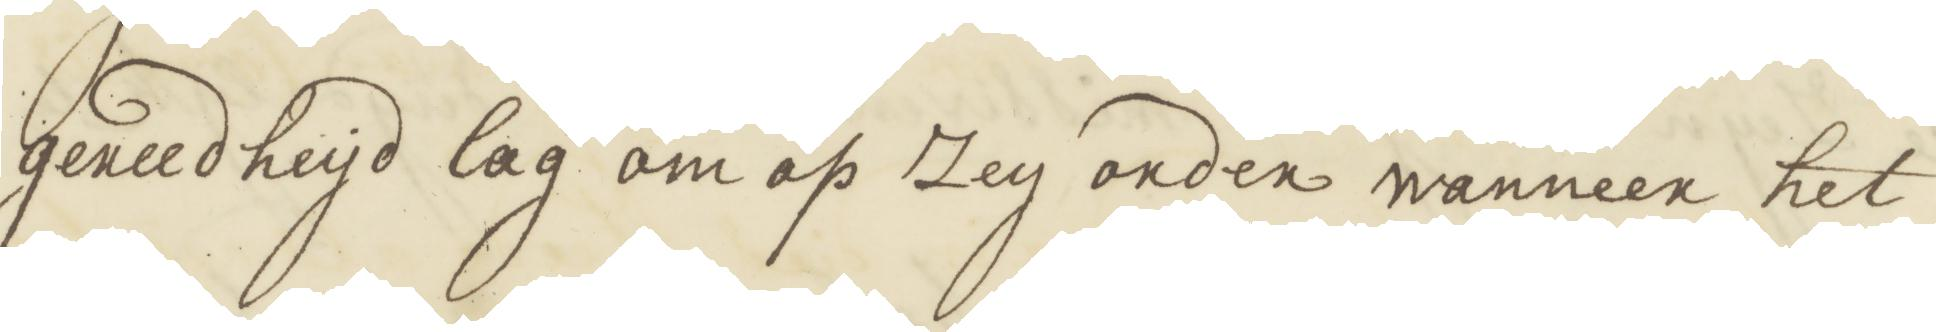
gereedheijd lag om op zey order wanneer het
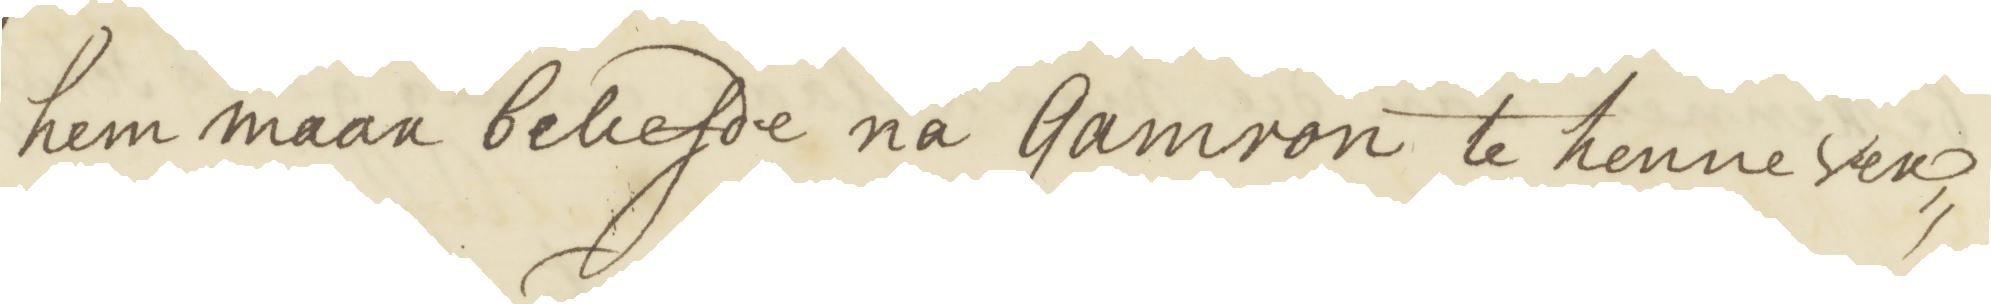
hem maar beliefde na Gamron te kenne ver„
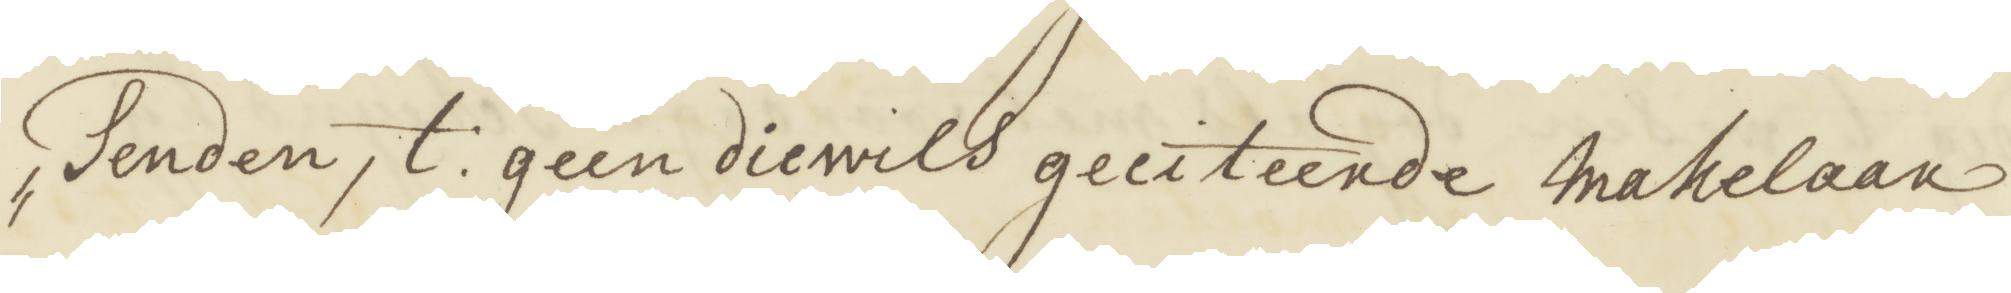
„senden, t: geen dicwils geciteerde makelaar
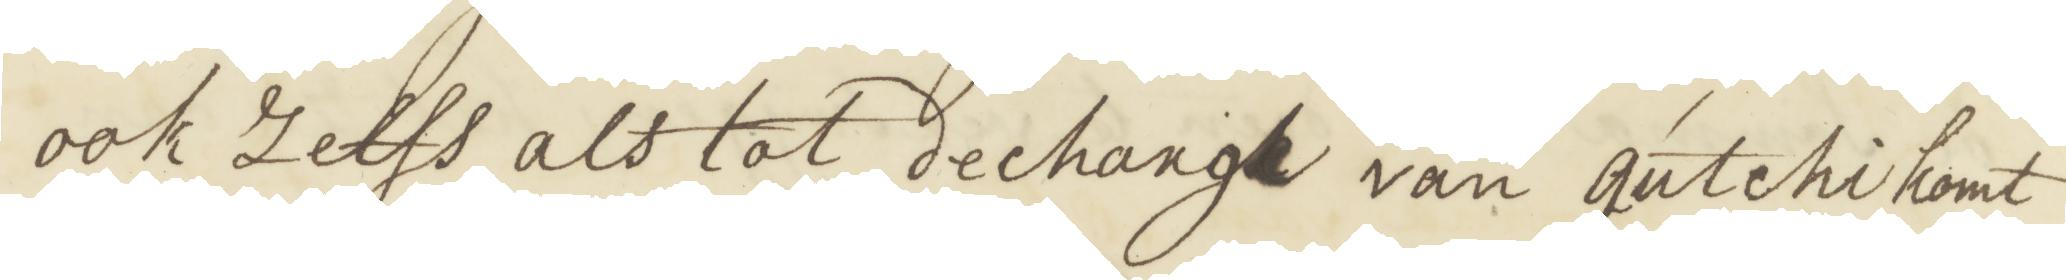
ook zelfs als tot decharge van gutchi komt
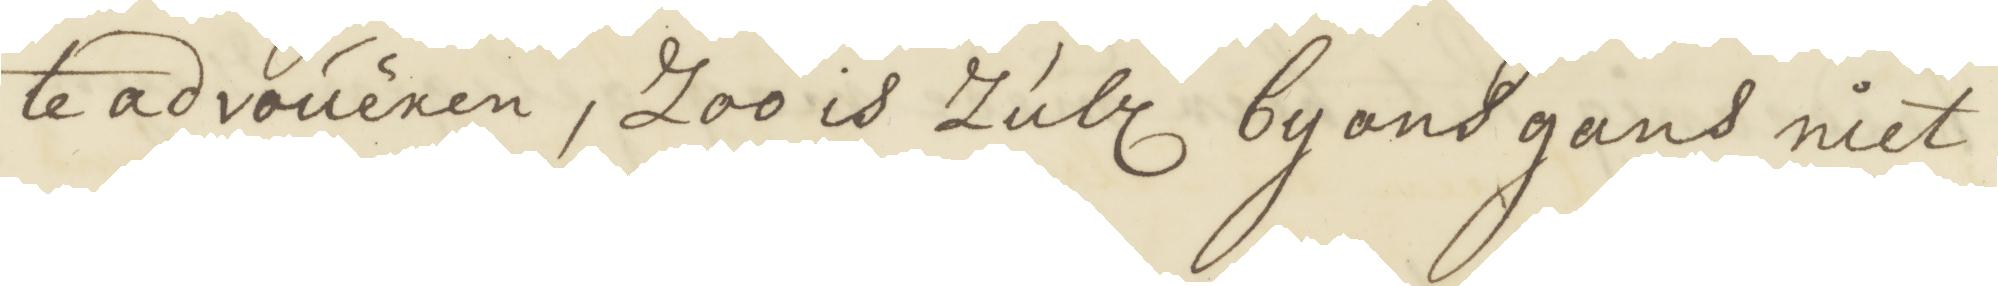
te advouëren, Zoo is zulx by ons gans niet
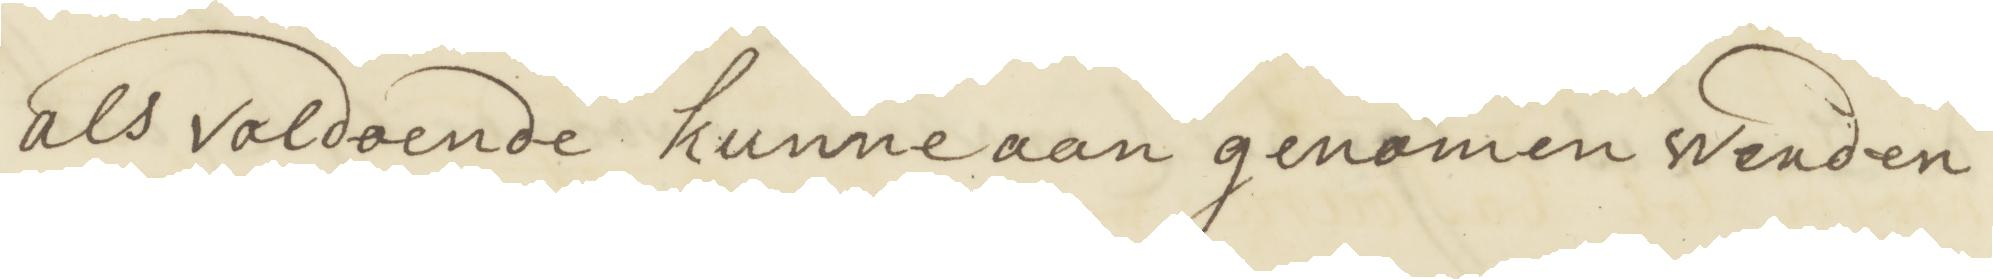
als voldoende kunne aan genomen werden
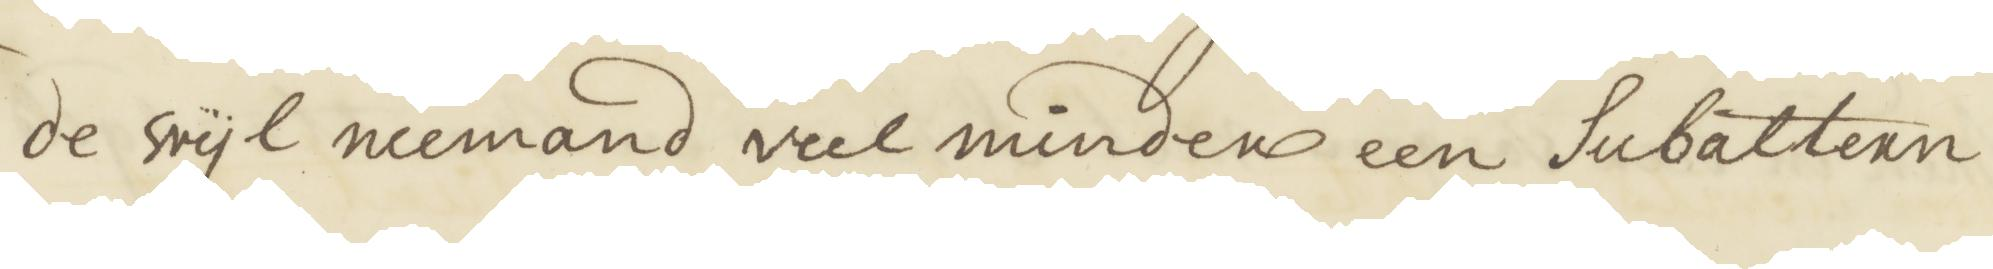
de wijl niemand veel minder een subaltern
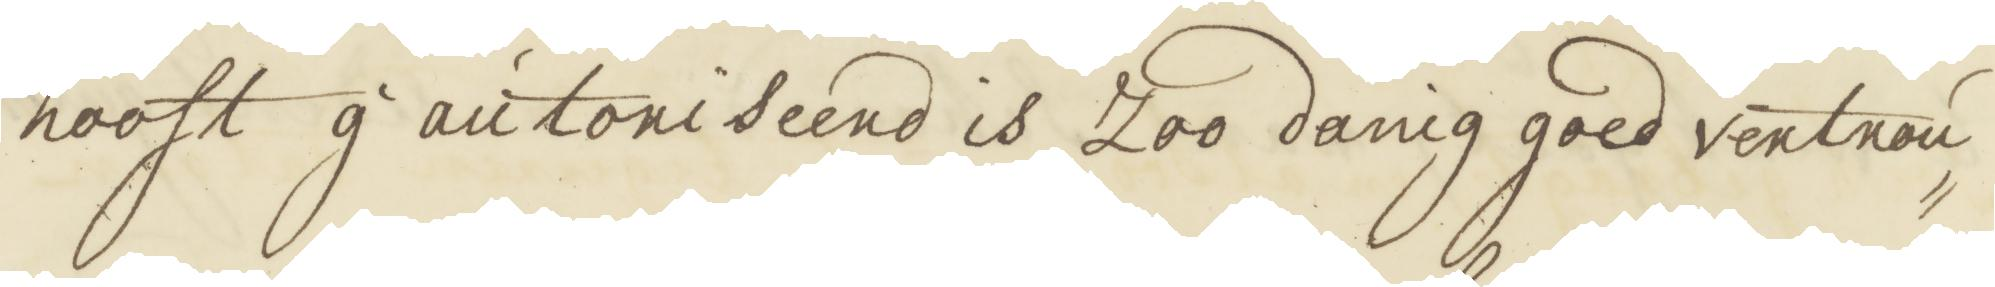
hooft g’autoriseerd is zoo danig goed vertrou„
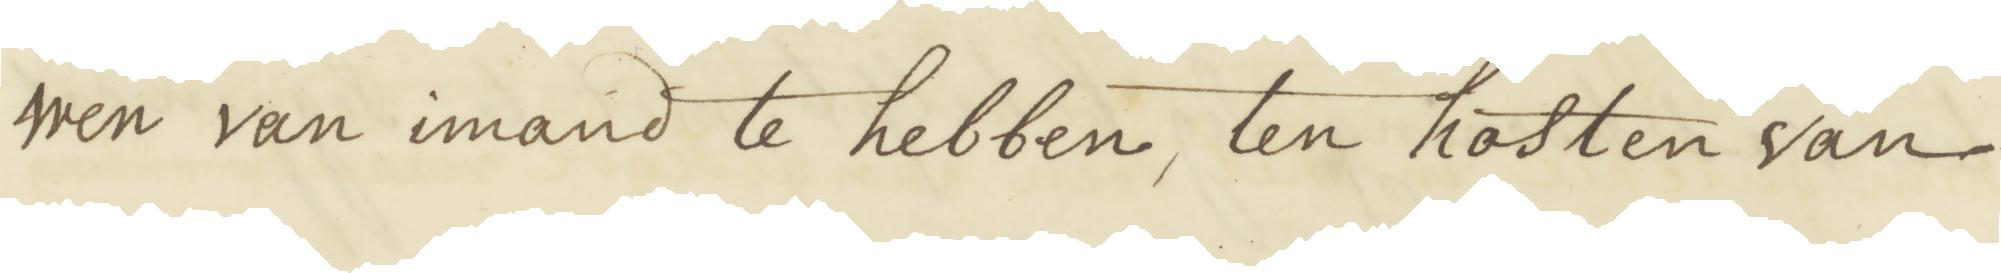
wer van imand te hebben, ten kosten van
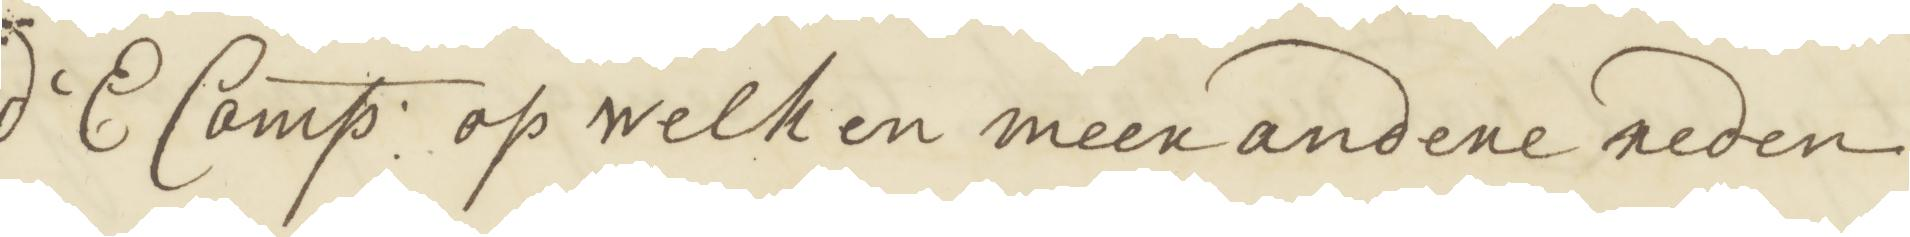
d’ E Comp: op welk en meer andere reden
